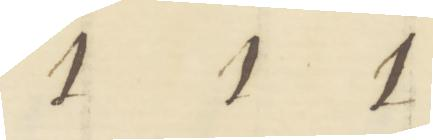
1 1 1
